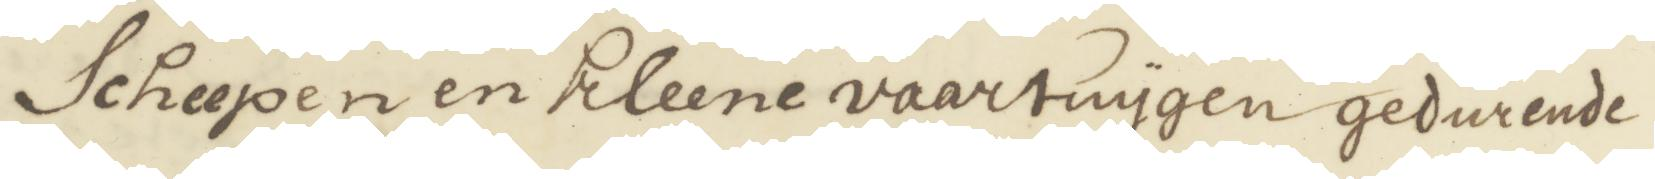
scheepen en kleene vaartuijgen gedurende
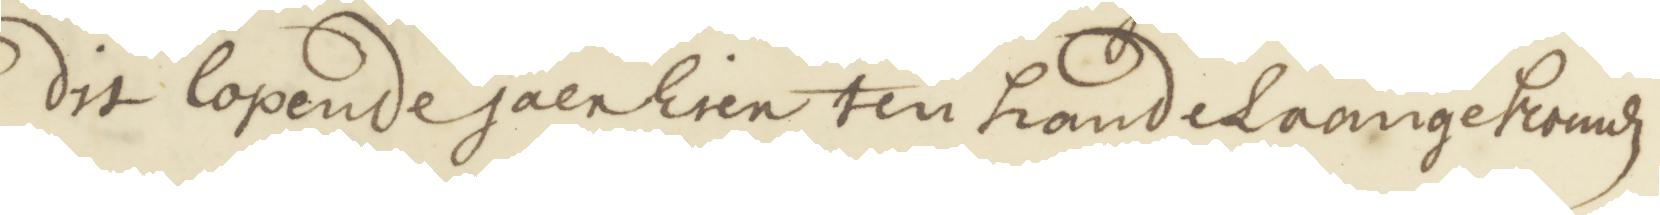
dit lopende jaer hier ten handel aangekomen
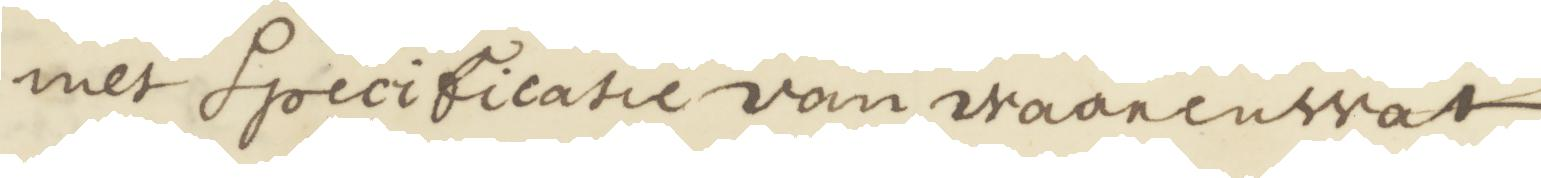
met specificatie van waaren wat
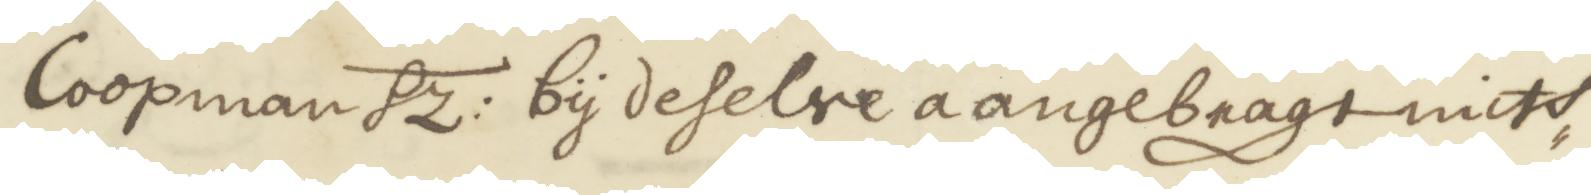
Coopmansz: bij deselve aangebragt mits„
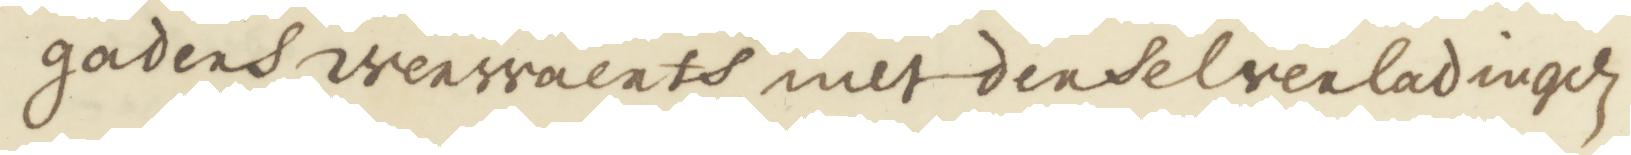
gaders verwaerts met derselver ladingen
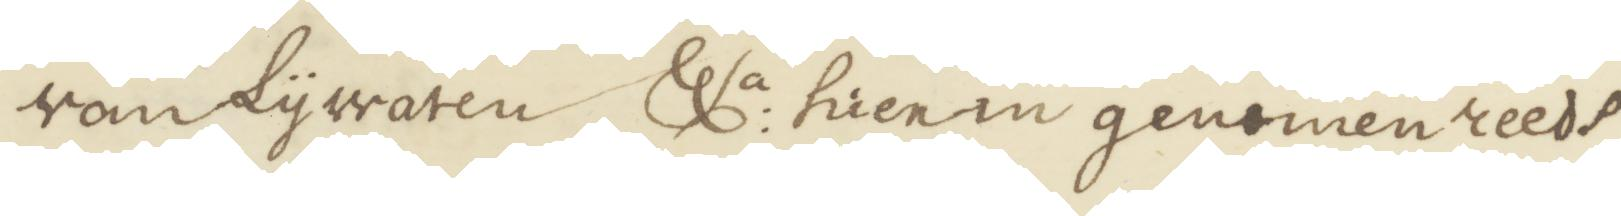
van Lijwaten &:a hierin genomen reeds
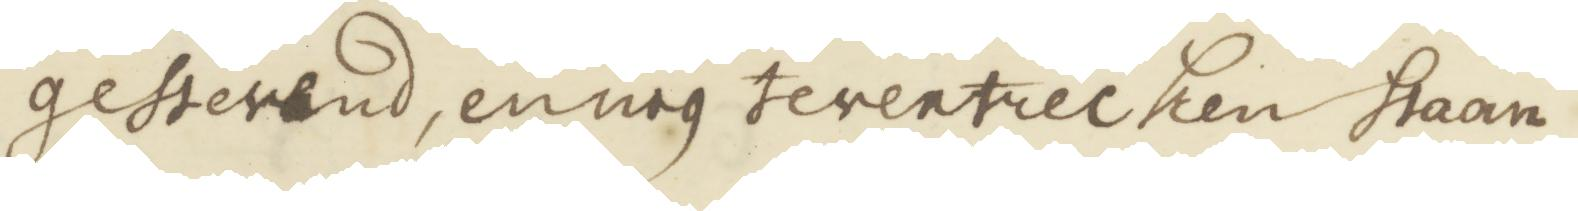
gestevend, en nog te vertrecken staan
